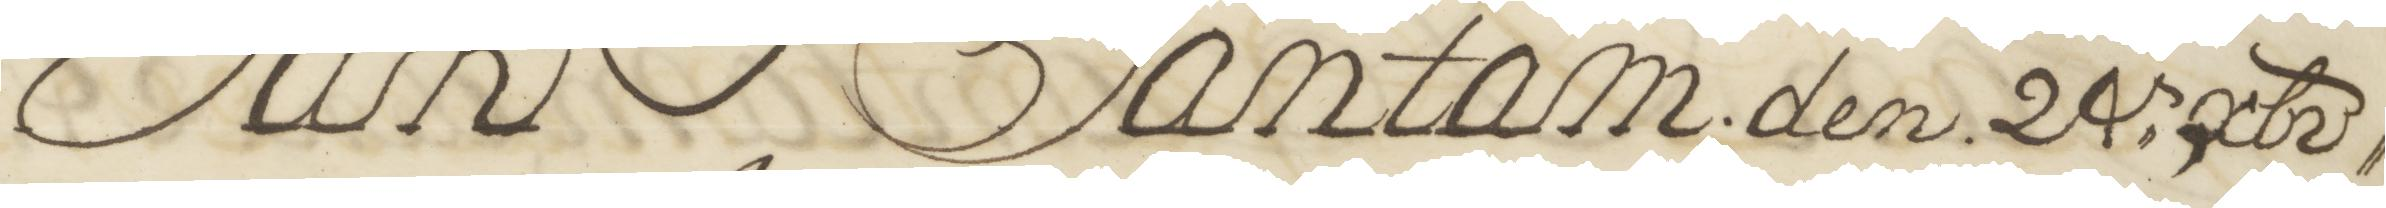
Van Bantam. den. 24„n xbr„
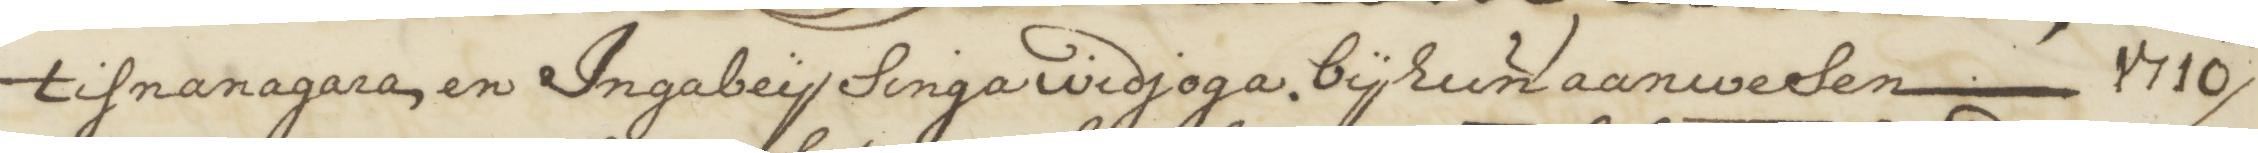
tisnanagara en Ingabeij Singa widjoga bij hun aanwesen 1710
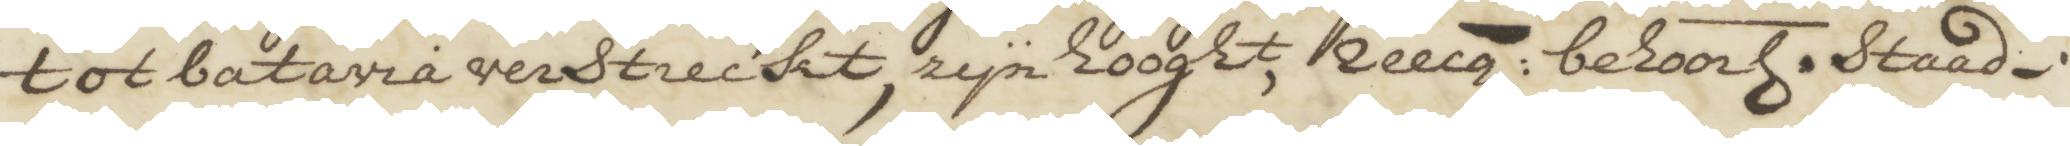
tot batavia verstreckt, zijn hoogh‚t reecq: behoorlijk„ staad_.
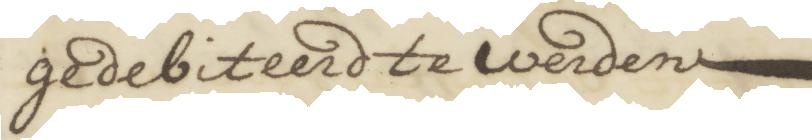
gedebiteerd te werden
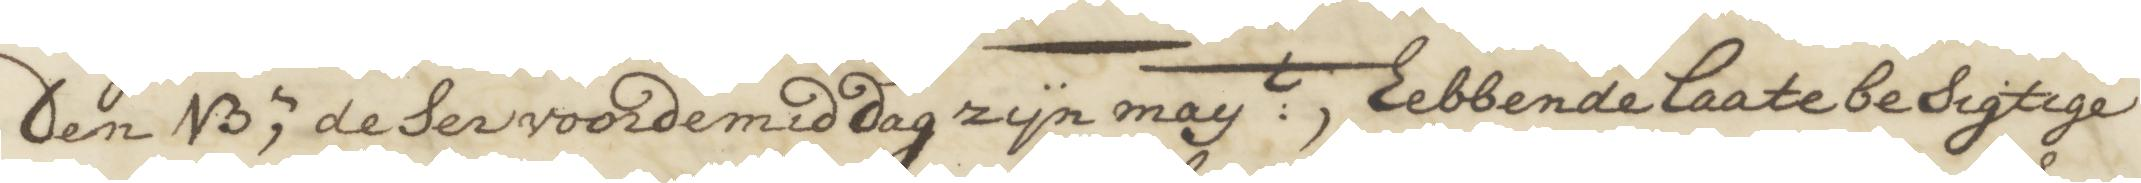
den 13‚n deser voordemiddag zijn may:t, hebbende laate besigtige
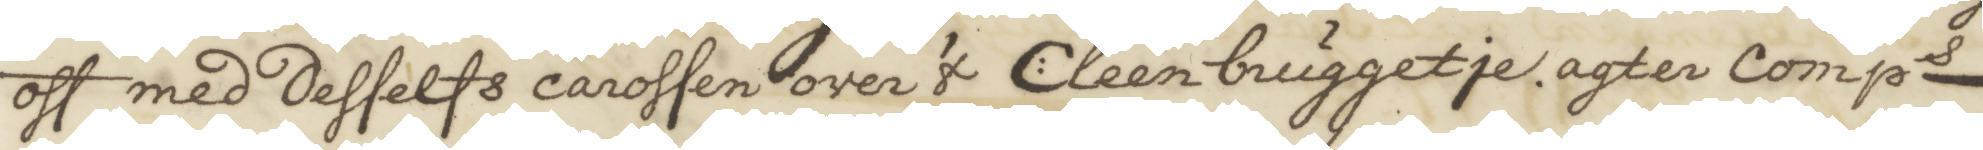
off med desselfs carossen over ’t Cleen bruggetje agter Comp_s
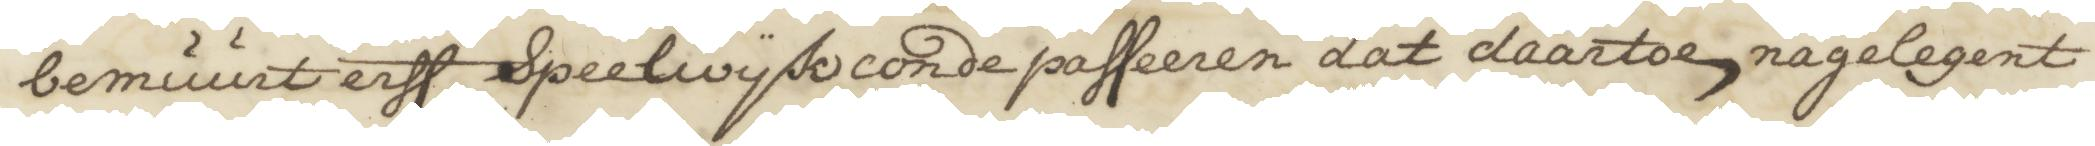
bemuurt erff speelwijk conde passeeren dat daartoe nagelegent
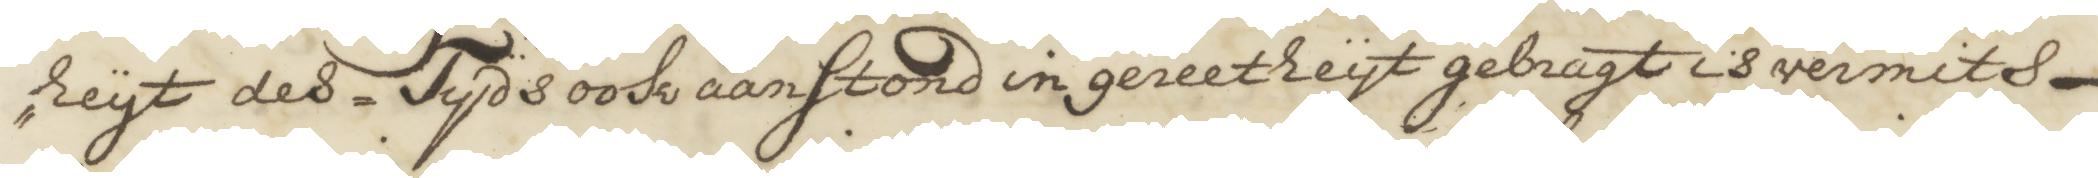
„heijt des = Tijds ook aanstond in gereetheijt gebragt is vermits _
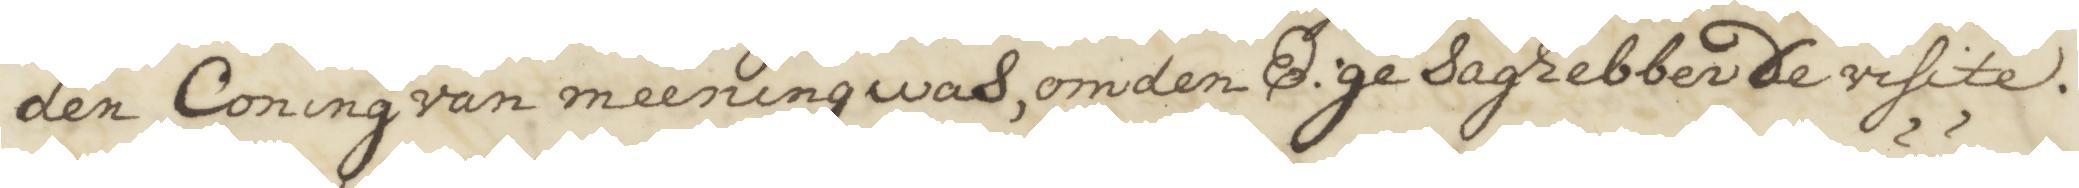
den Coning van meening was, om den E: gesaghebber de visite.
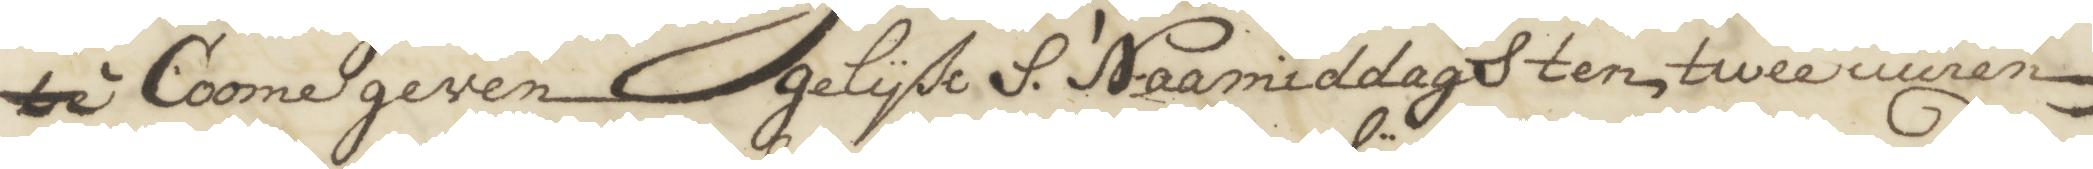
te' Coome geven gelijk s. ’Naamiddags ten twee uuren
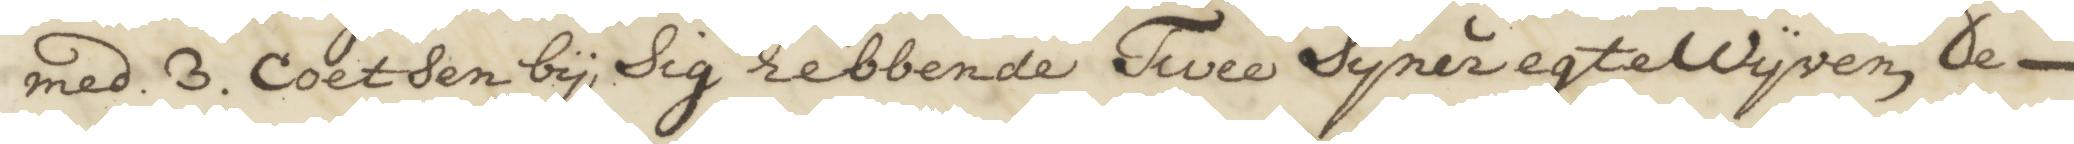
med. 3. coetsen bij sig hebbende Twee sijner egteWijven, de _
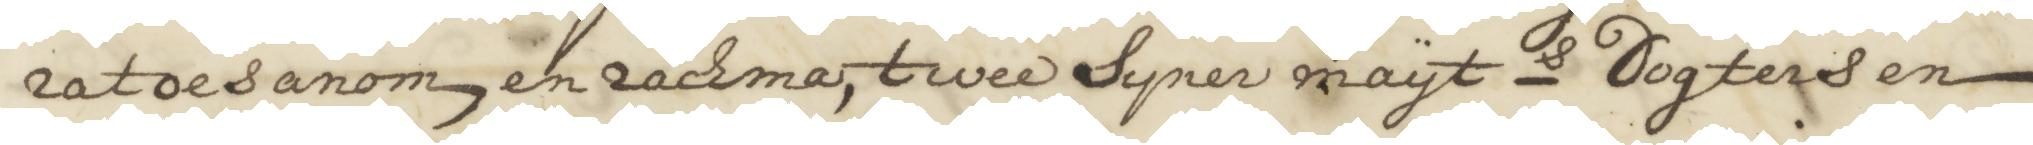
ratoe sanom, en rachma, twee syner maijt_s dogters en
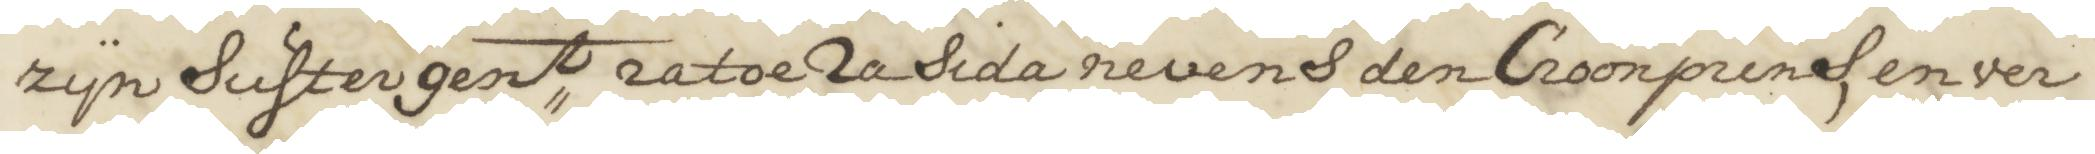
zijn suster gen„t ratoe rasida, nevens den Croonprins, en ver
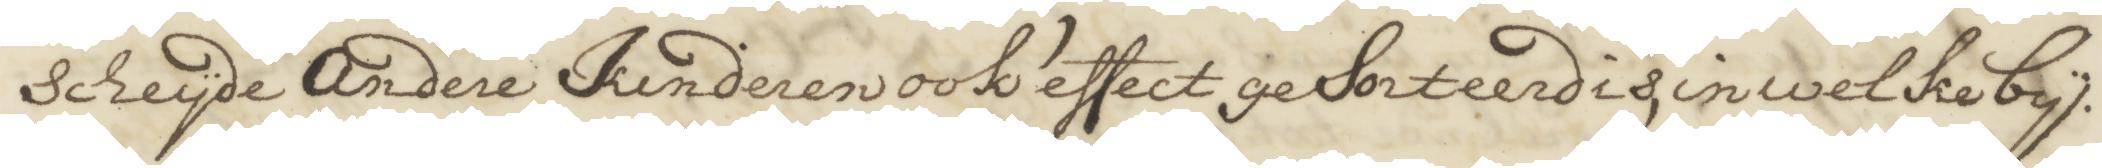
scheijde Andere Kinderen ook effect gesorteerd is, in welke bij.
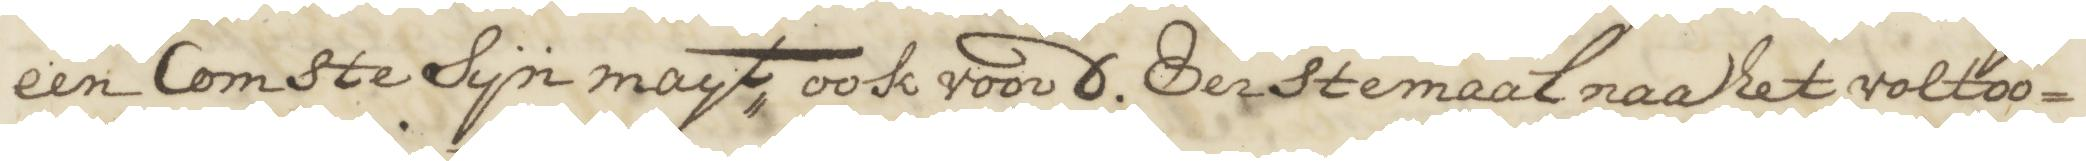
een Comste sijn maijt„ ook voor d. Eerstemaal naa het voltoo=
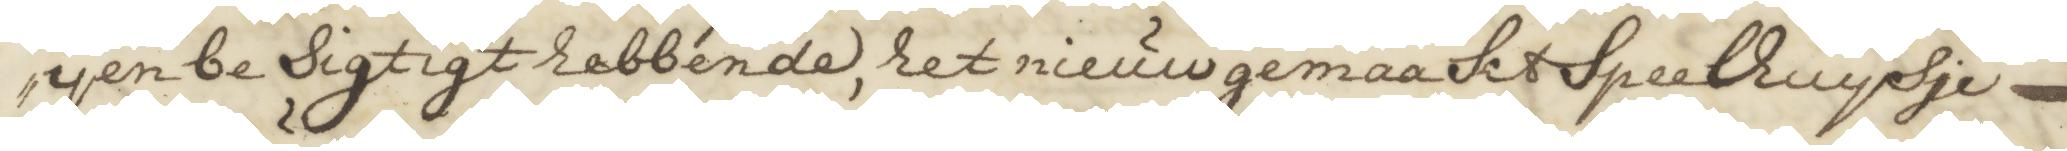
„ijen besigtigt hebbende, het nieuw gemaakt speelhuijsje' _
